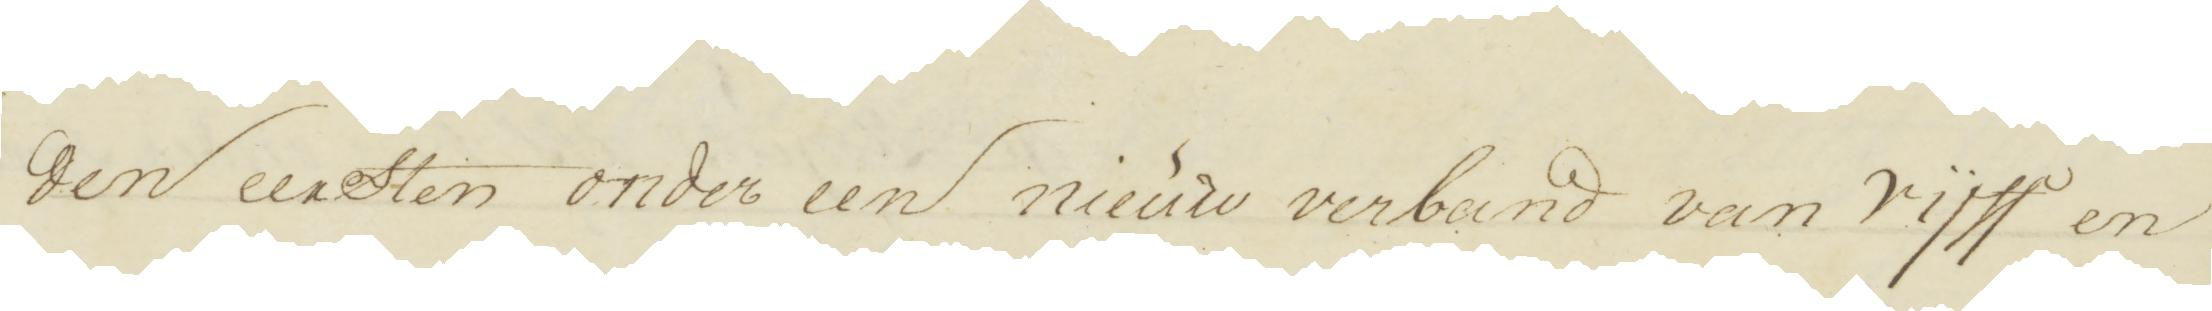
den eersten onder een nieuw verband van vijff en
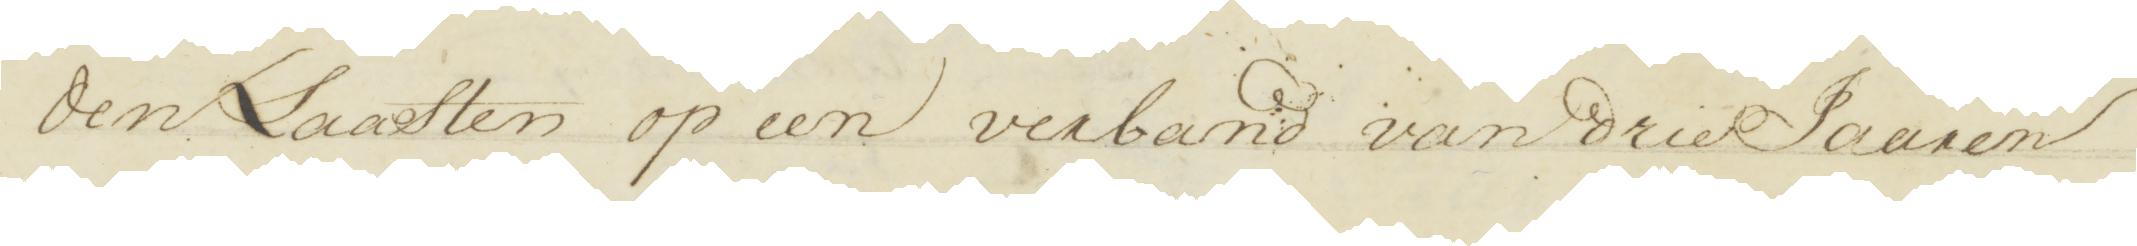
den laasten op een verband van drie Jaaren
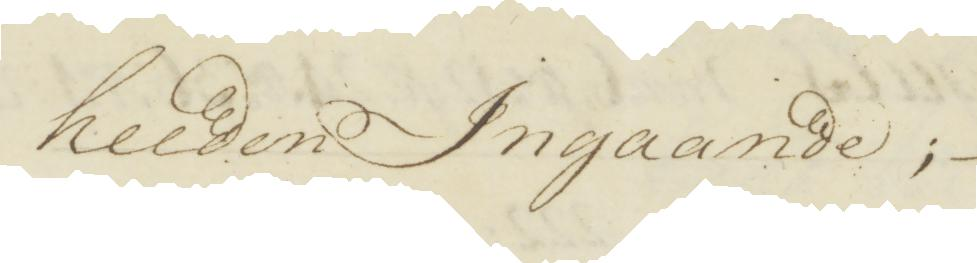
heeden Ingaande;—
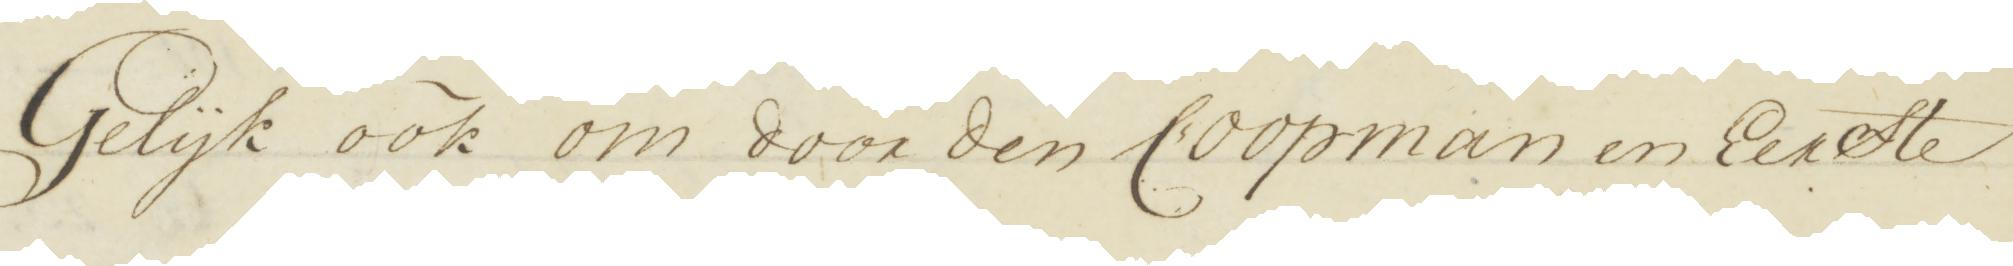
Gelijk ook om door den Coopman en Eerste
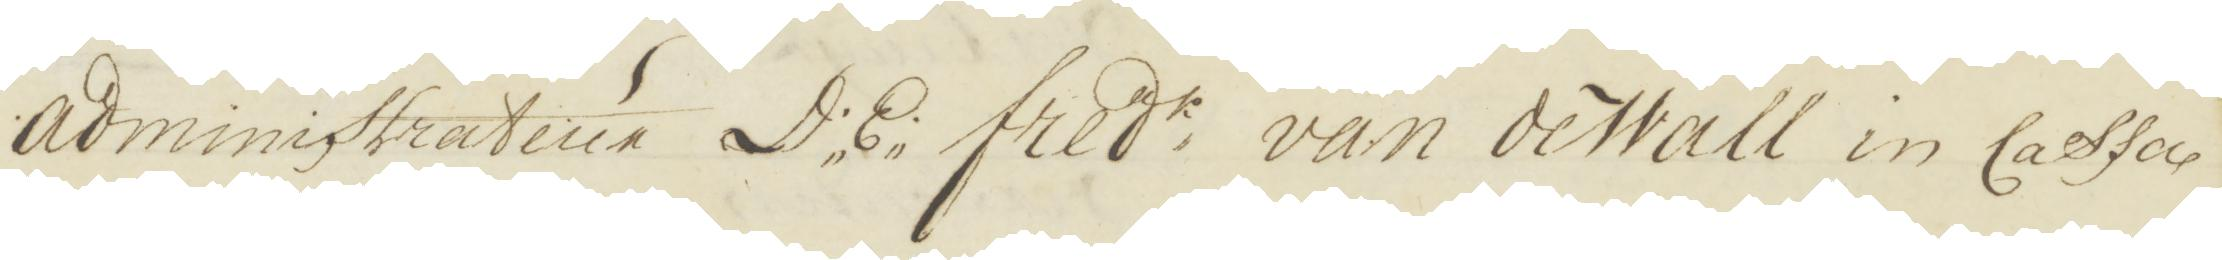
administrateur D.„ E.„ fred„k van deWall in cassa
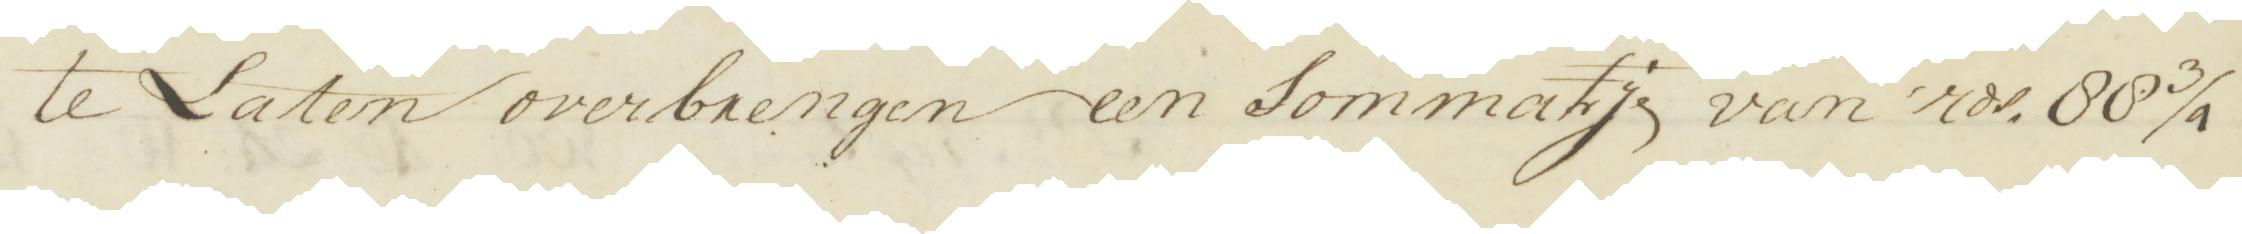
te laten overbrengen een sommatjen van rd„s 88¾
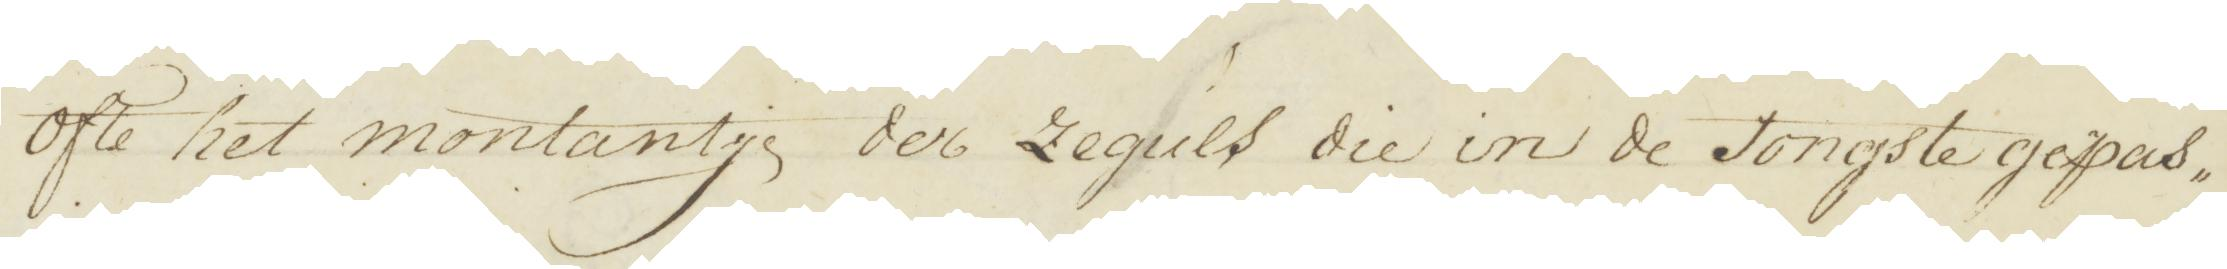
ofte het montantjen der zeguls die in de Jongste gepas„
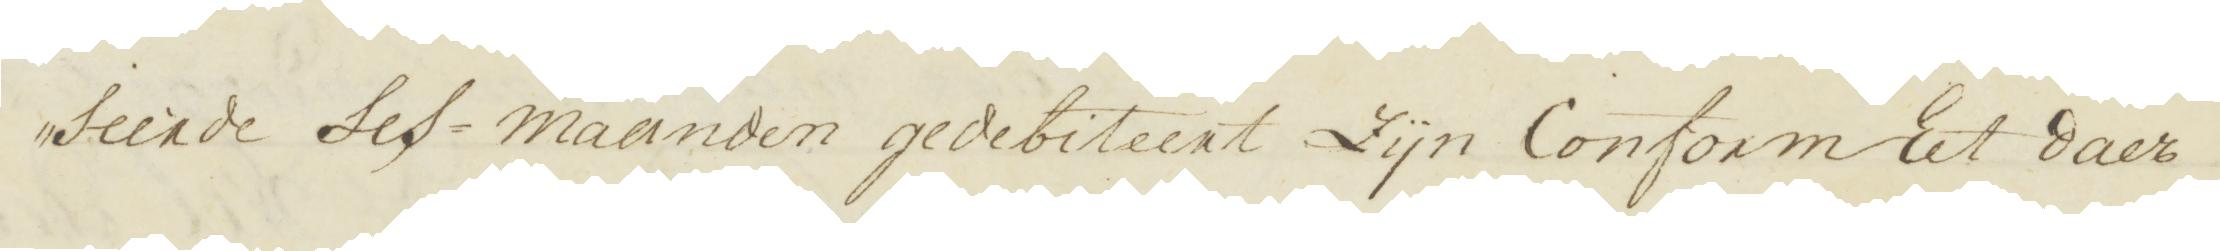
seerde ses= maanden gedebiteert zijn conform het daer
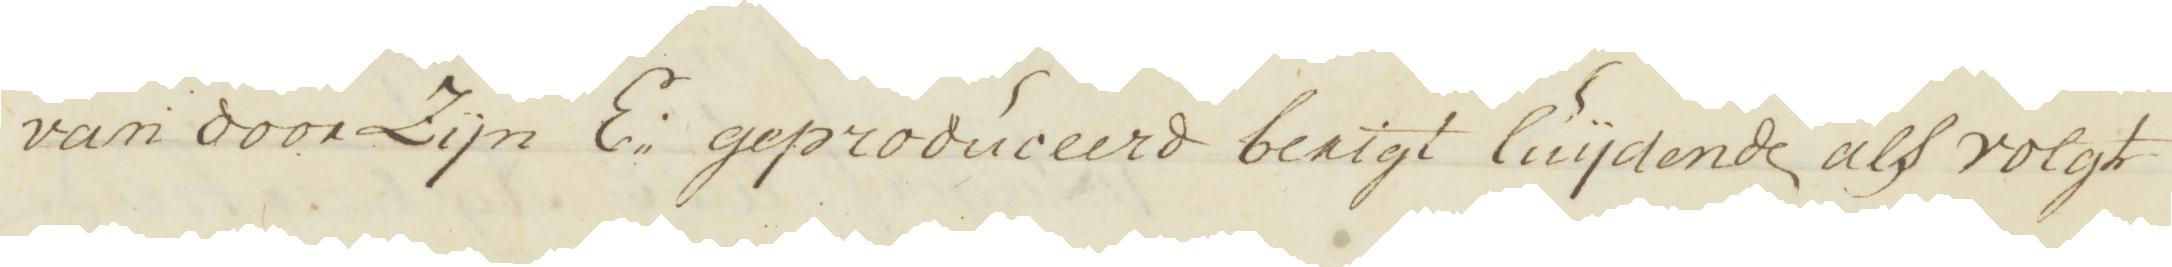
van door Zijn E„ geproduceerd berigt luijdende als volgt
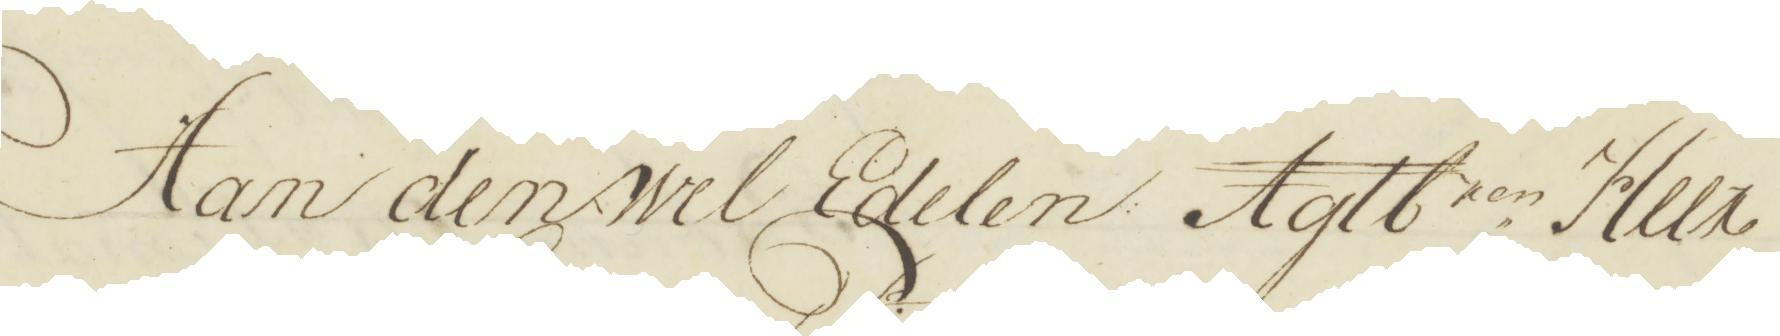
Aan den wel Edelen Agtb„ren Heer
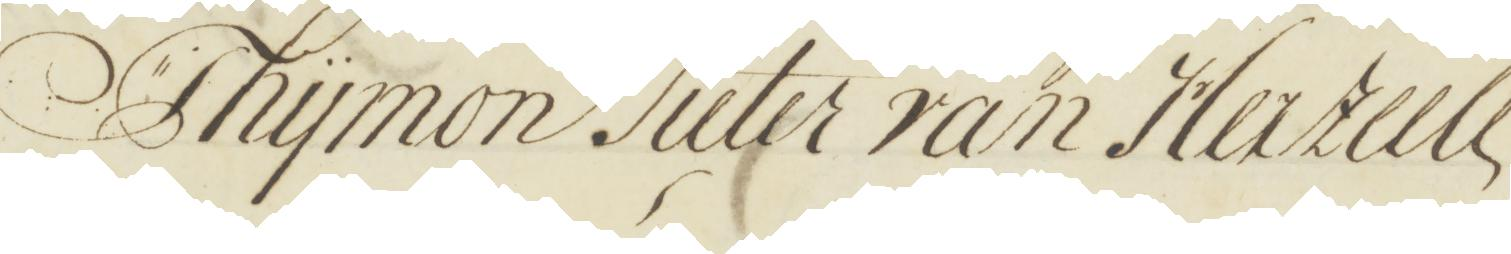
Thijmon Pieter van Herzeele
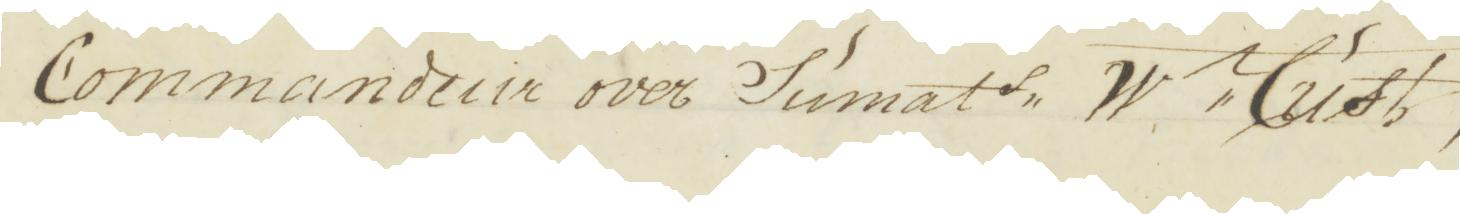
Commandeur over Sumat„s W„t Cust,
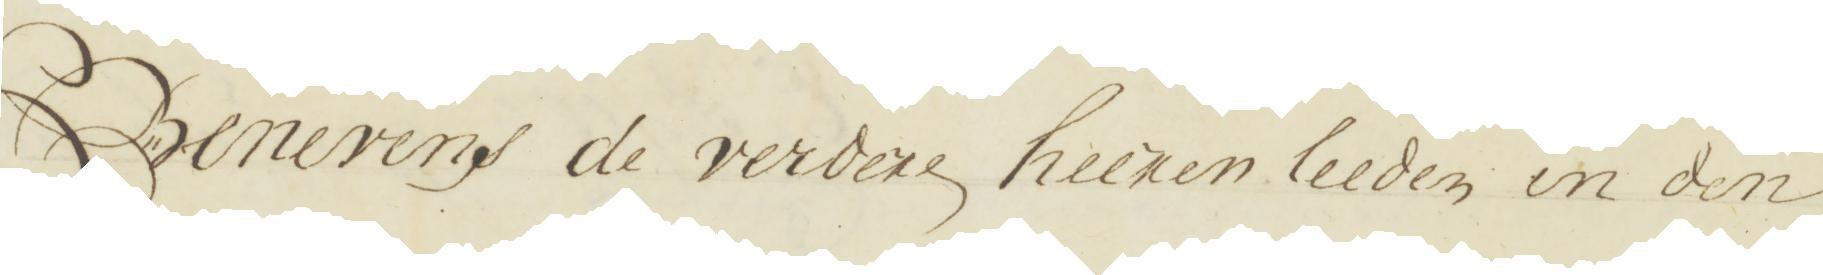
Benevens de verdere heeren leeden in den
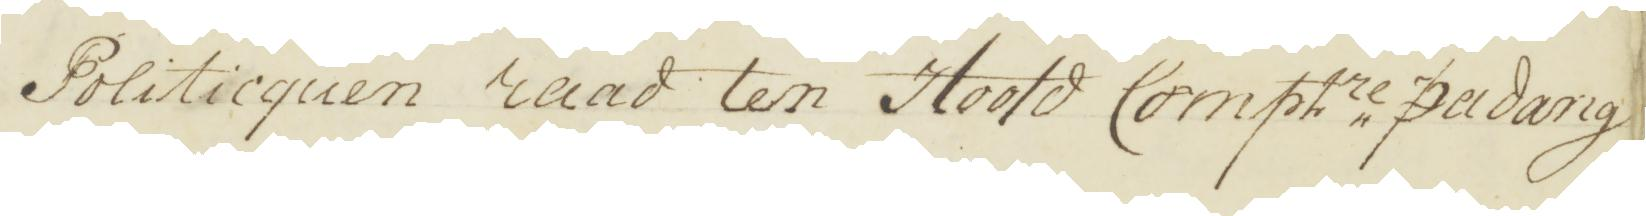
Politicquen raad ten Hoofd Compt„re padang
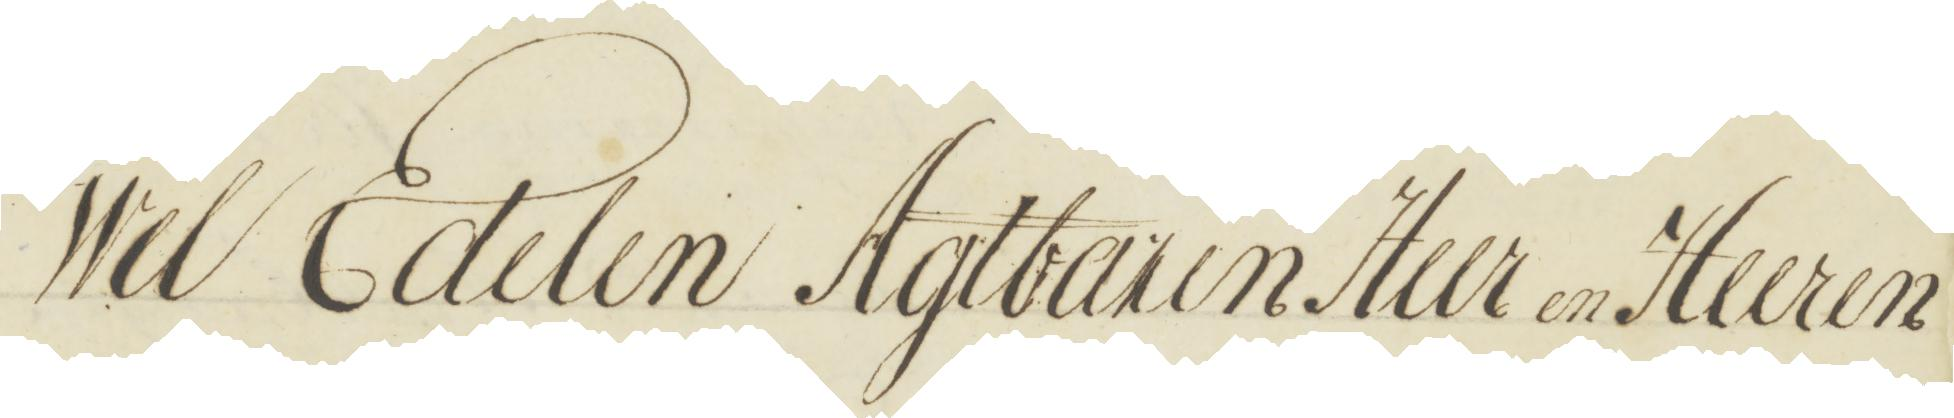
Wel Edelen Agtbaren Heer en Heeren
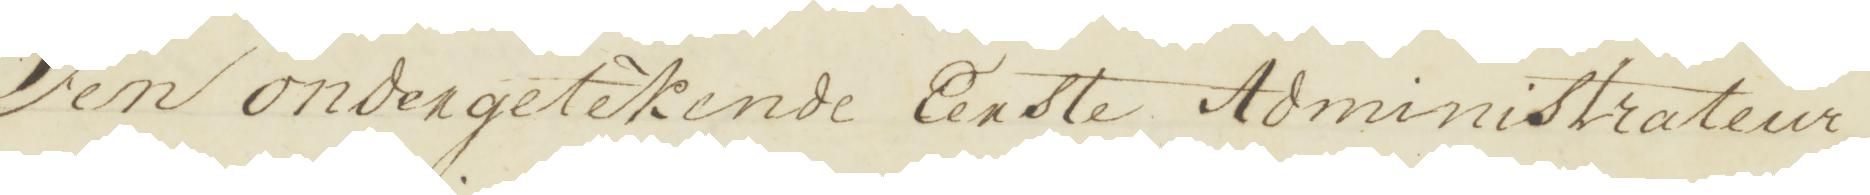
Den ondergetekende Eerste Administrateur
